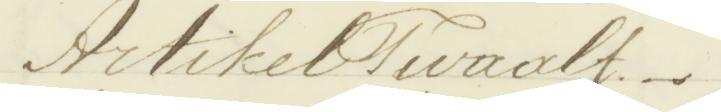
Artikel Twaalf. —
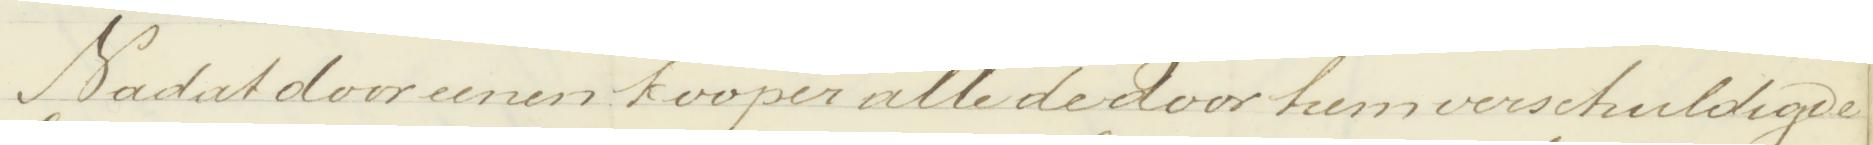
Nadat door eenen kooper alle de door hem verschuldigde
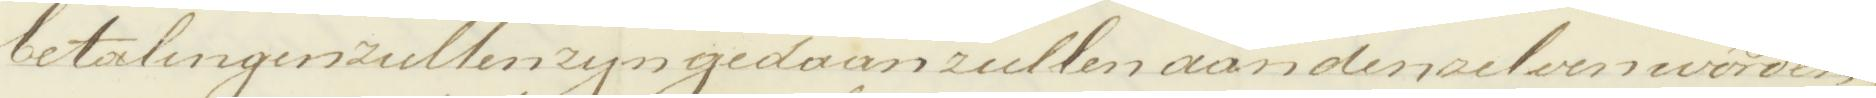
betalingen zullen zyn gedaan zullen aan denzelven worden
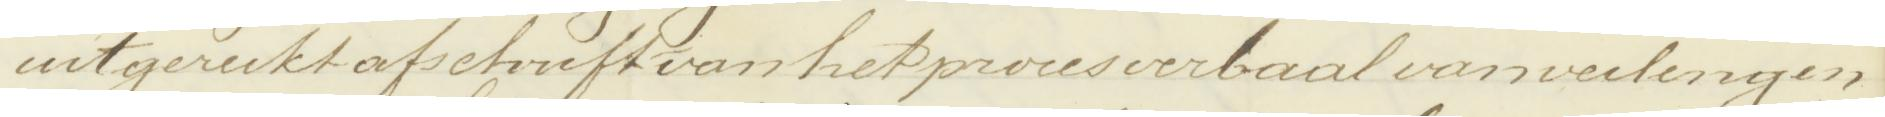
uitgereikt afschrift van het procesverbaal van veilingen
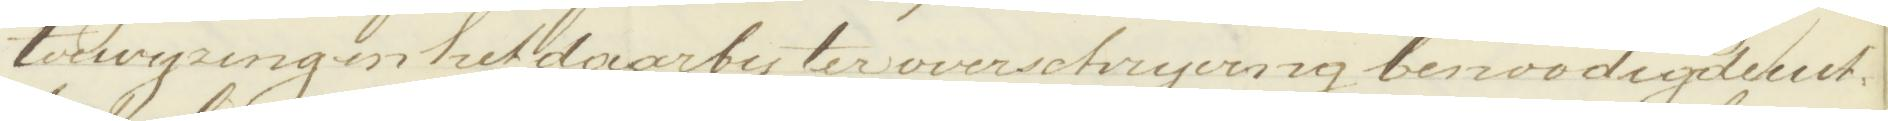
toewyzing en het daarby ter overschryving benoodigde uit.
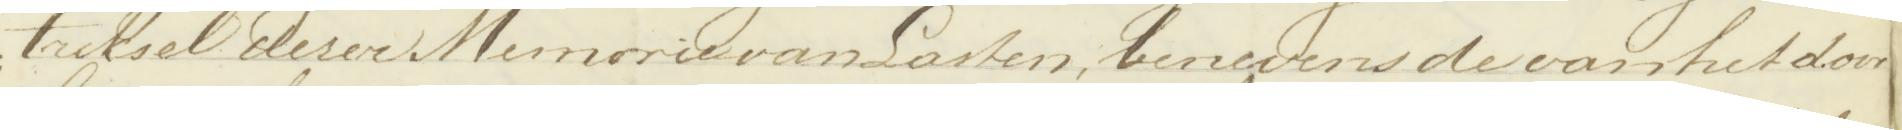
„treksel dezer Memorie van Lasten, benevens de van het door
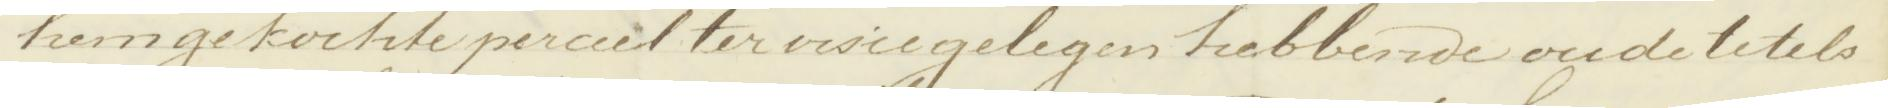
hem gekochte perceel ter visie gelegen hebbende oude titels
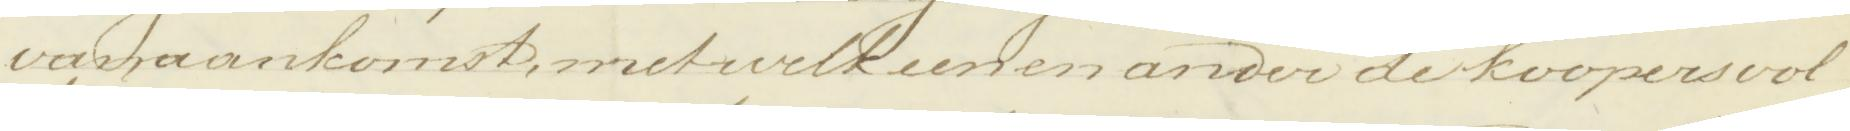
van aankomst, met welk een en ander de koopers vol
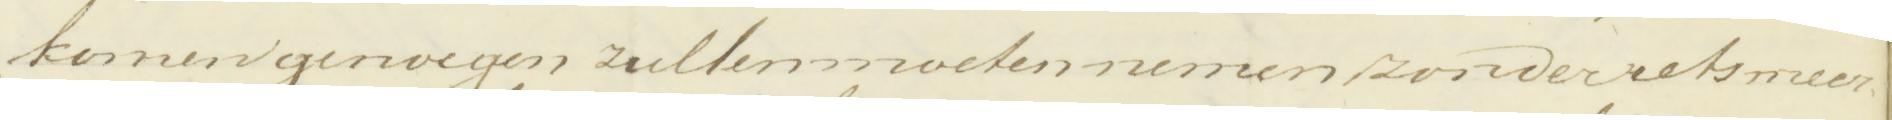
komen genoegen zullen moeten nemen, zonder iets meer
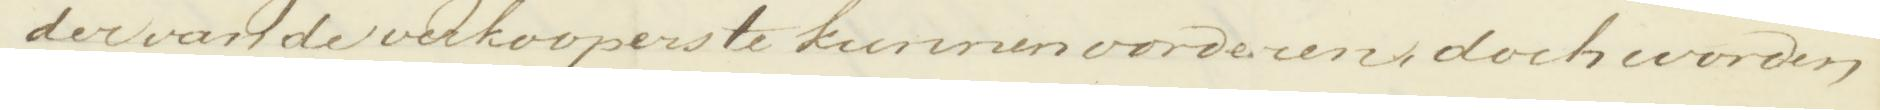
der van de verkoopers te kunnen vorderen, doch worden
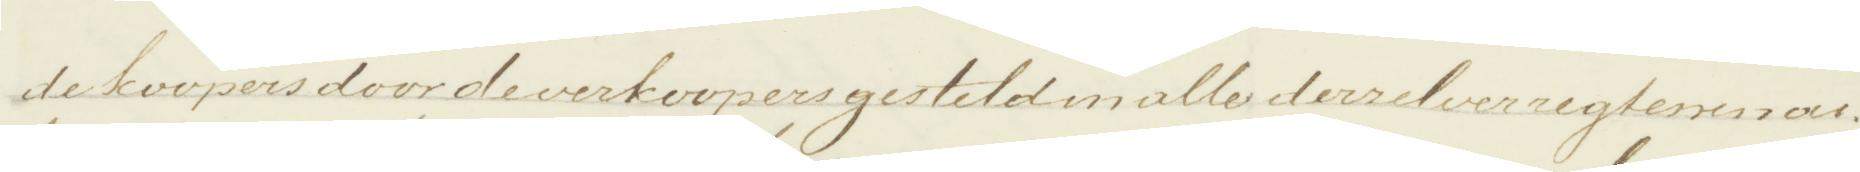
de koopers door de verkoopers gesteld in alle derzelver regten en ac
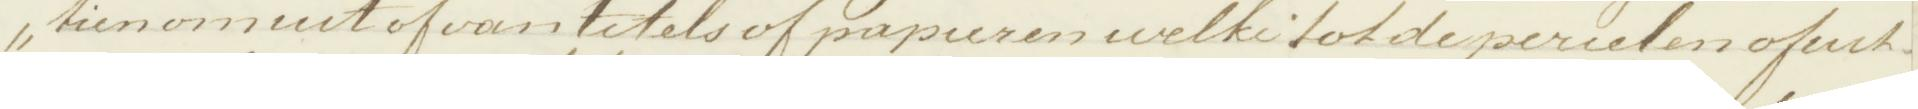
„tien om uit of van titels of papieren welke tot de percelen of uit
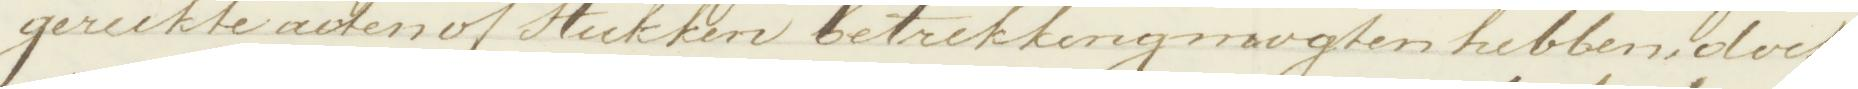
gereikte acten of stukken betrekking mogten hebben, doch
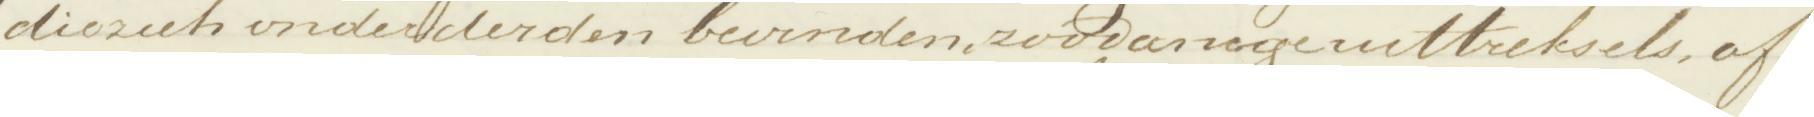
die zich onder derden bevinden, zoodanige uittreksels, af
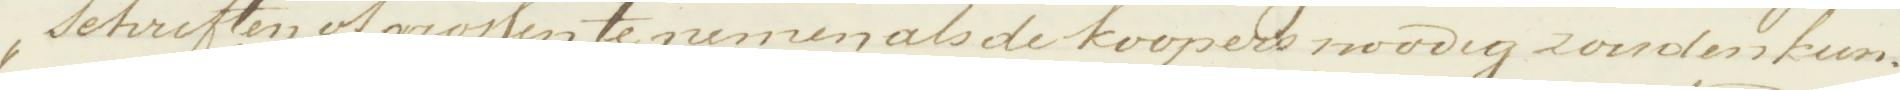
schriften of grossen te nemen als de koopers noodig zouden kun„
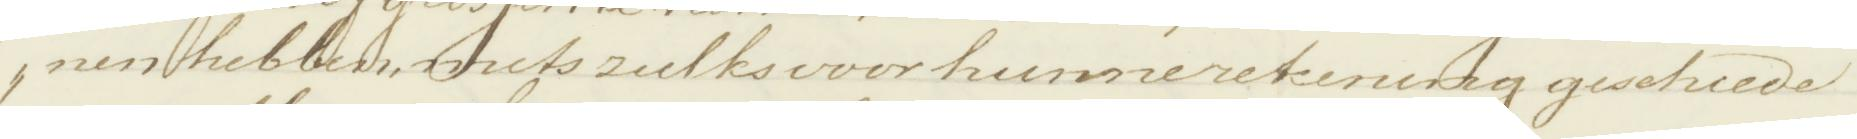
„nen hebben mits zulks voor hunne rekening geschiede
